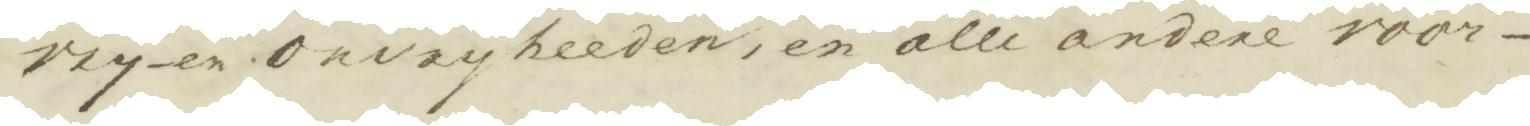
vry- en onvrijheeden, en alle andere voor-
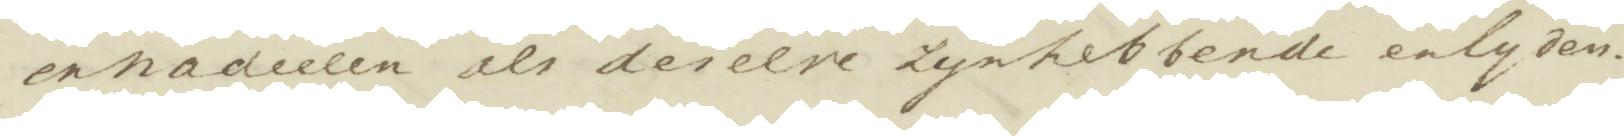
en nadeelen als deselve zyn hebbende en lyden.
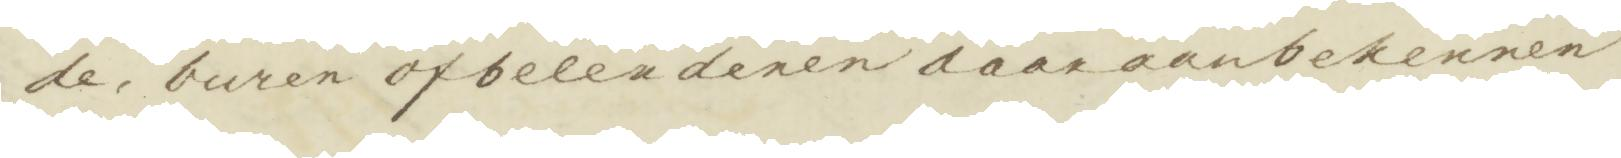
de, buren of belendenen daar aanbekennen
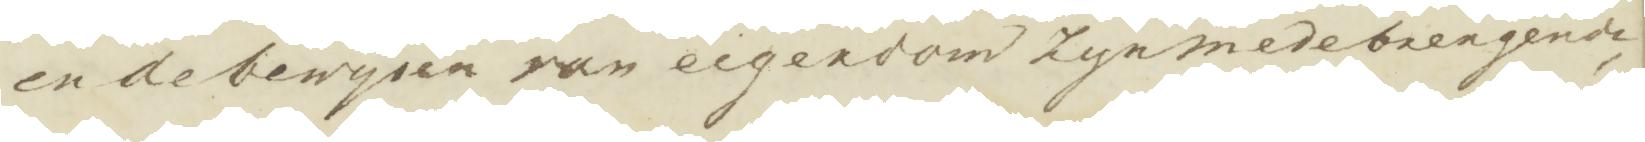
en de bewysen van eigendom zyn medebrengende,
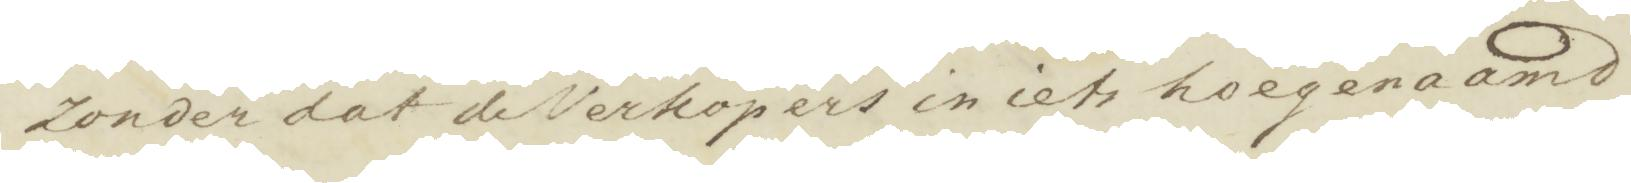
zonder dat de Verkopers in iets hoegenaamd
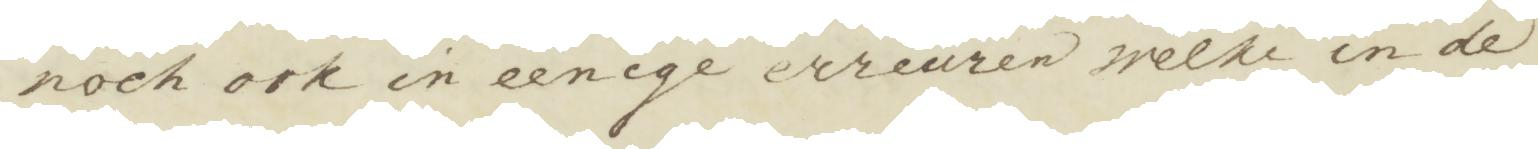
noch ook in eenige erreuren welke in de
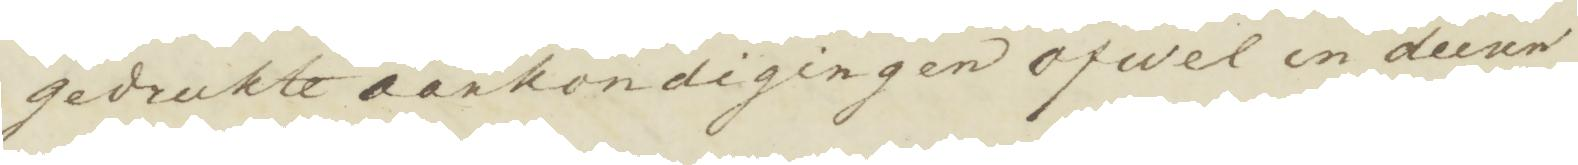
gedrukte aankondigingen ofwel in deesen
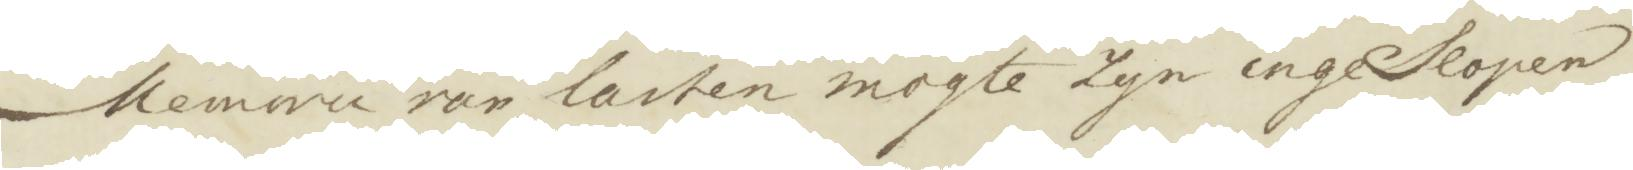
Memorie van lasten mogte zyn ingeslopen
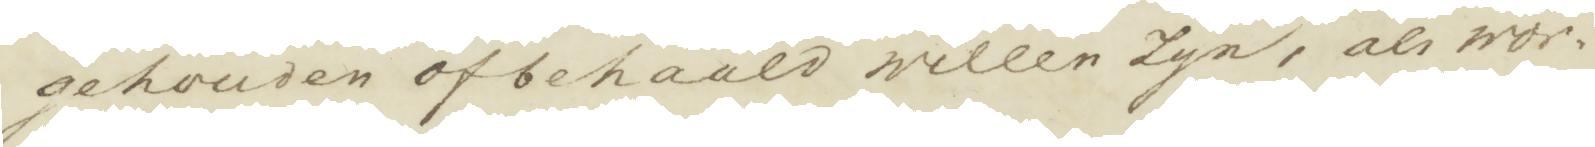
gehouden of behaald willen zyn, als wor,
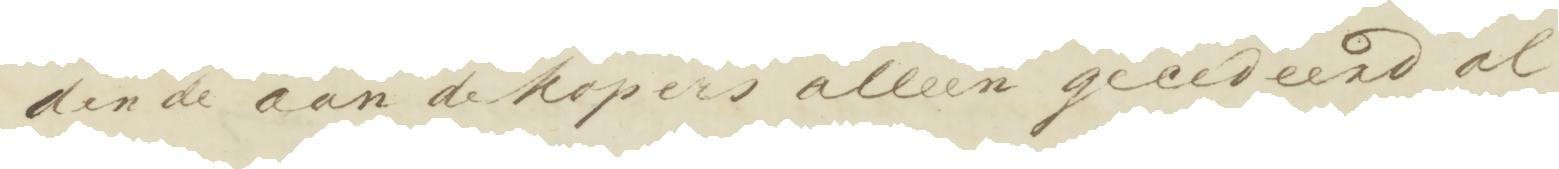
dende aan de kopers alleen gecedeerd al
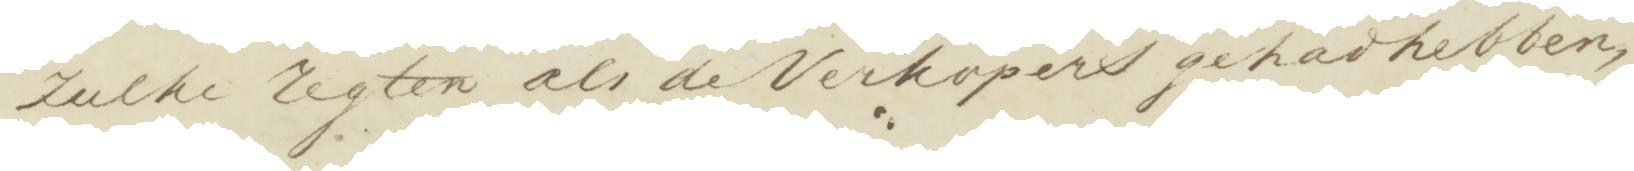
zulke regten als de Verkopers gehad hebben,
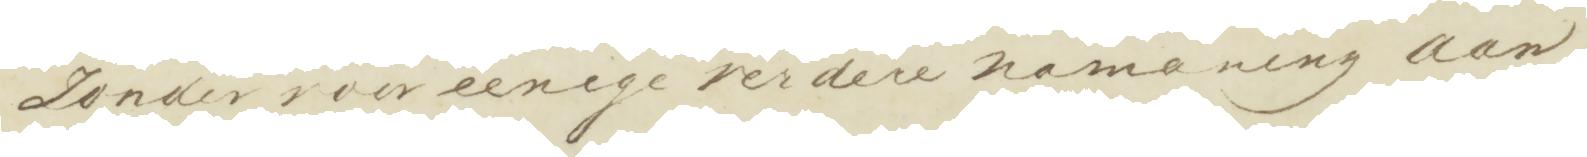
zonder voor eenige verdere namaning aan
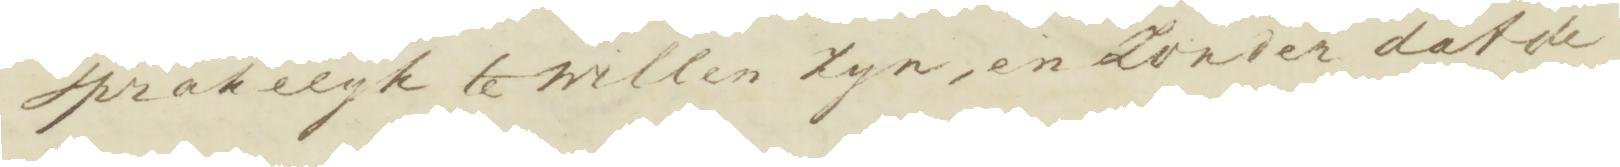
sprakelyk te willen zyn, en zonder dat de
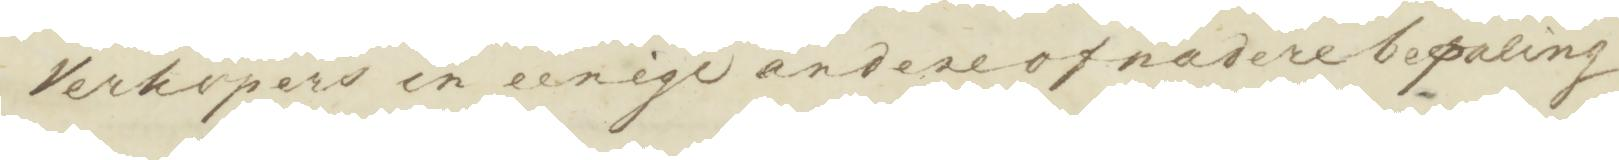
Verkopers in eenige andere of nadere bepaling
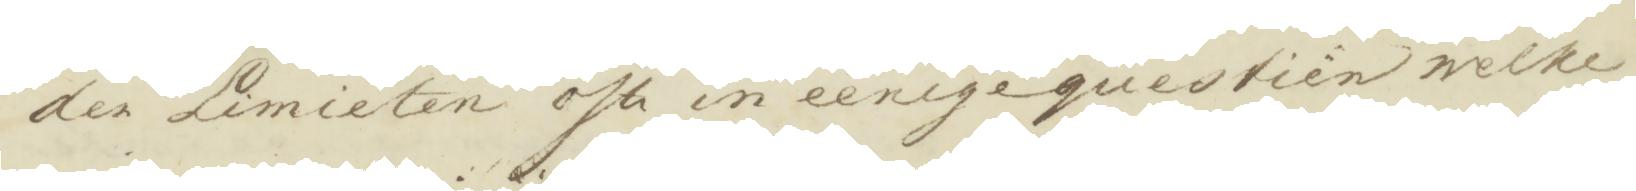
der Limieten ofte in eenige questiën welke
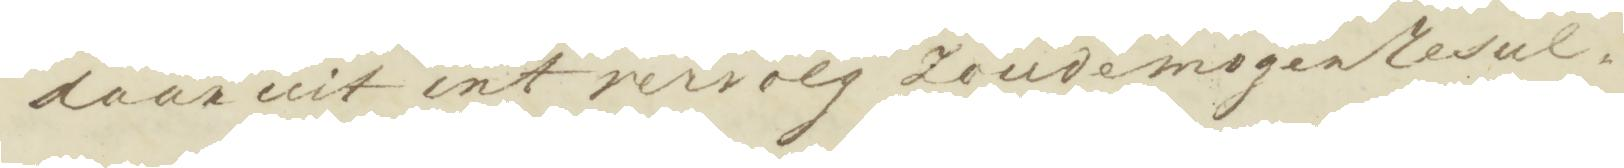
daar uit in 't vervolg zoude mogen resul„
